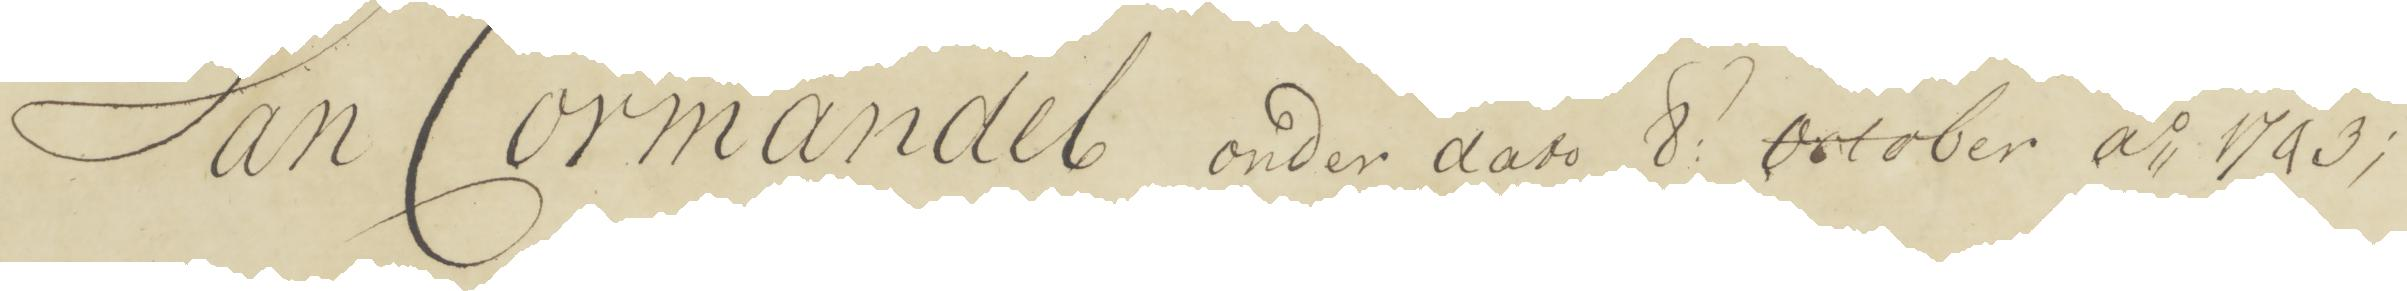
Van Cormandel onder dato 8:' october a„o 1743;
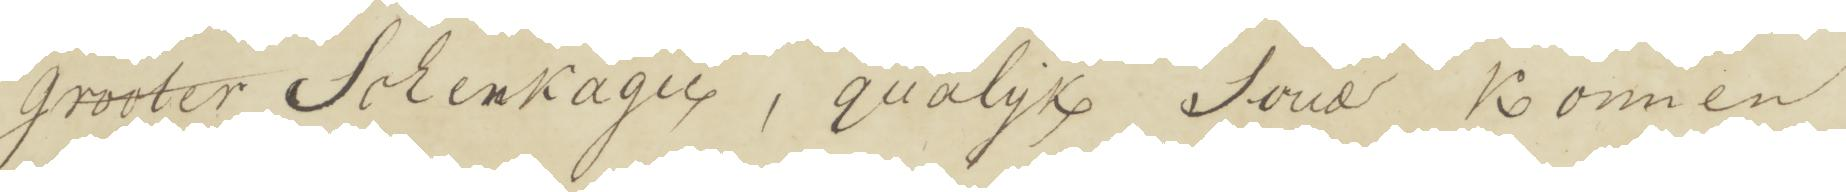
grooter schenkagie, qualijk soude konnen
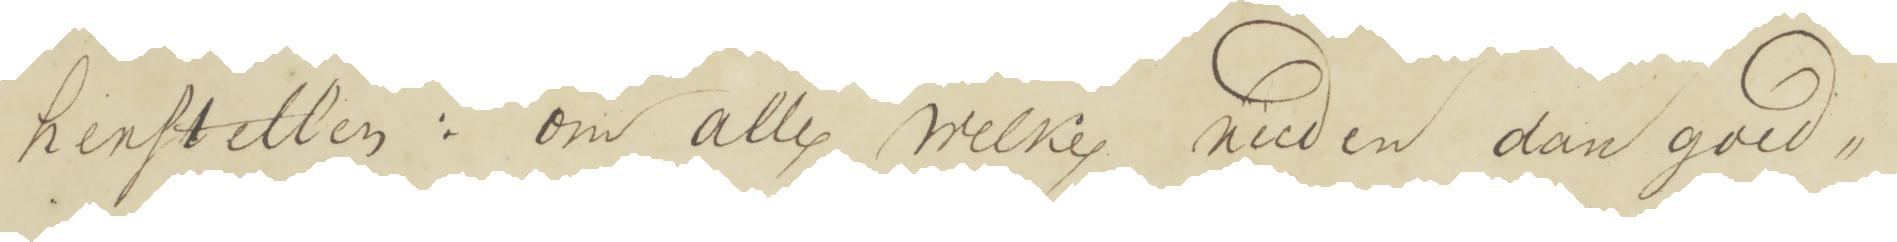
herstellen: om alle welke reeden dan goed„
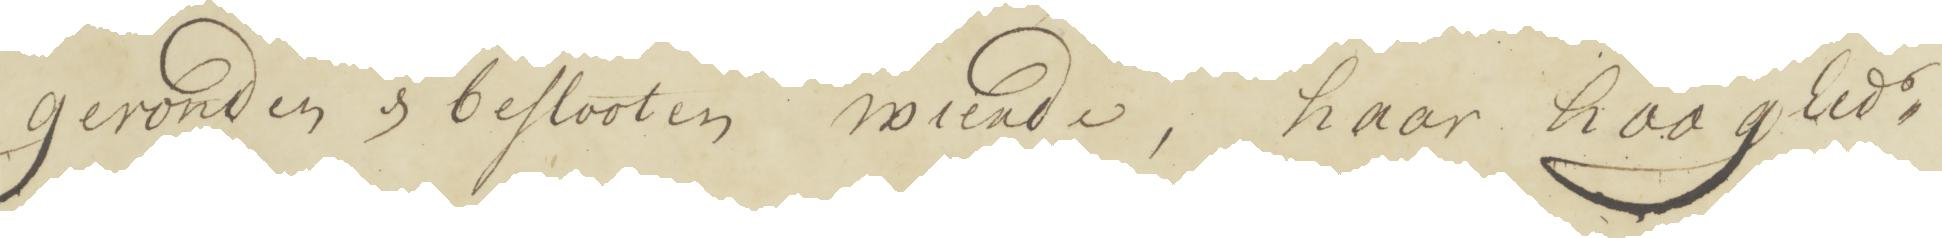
gevonden en beslooten wierde, haar hooghed„s
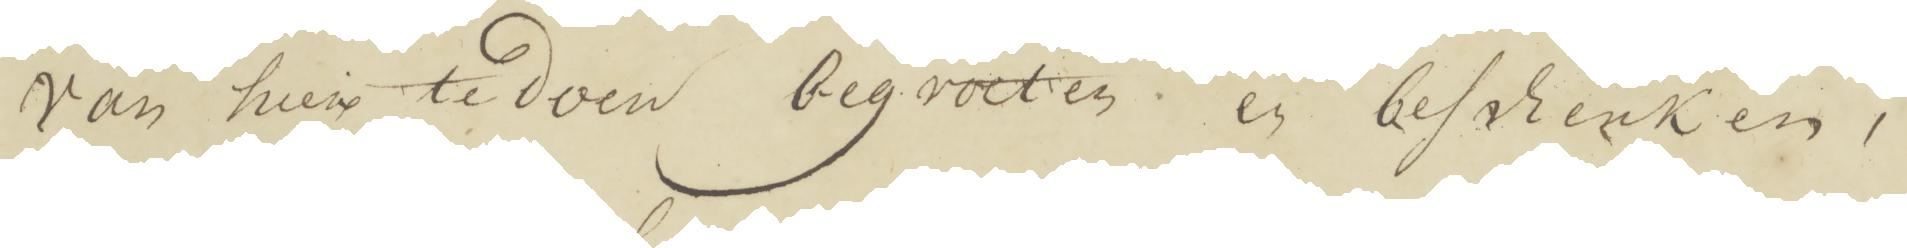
van hier te doen begroeten en beschenken,
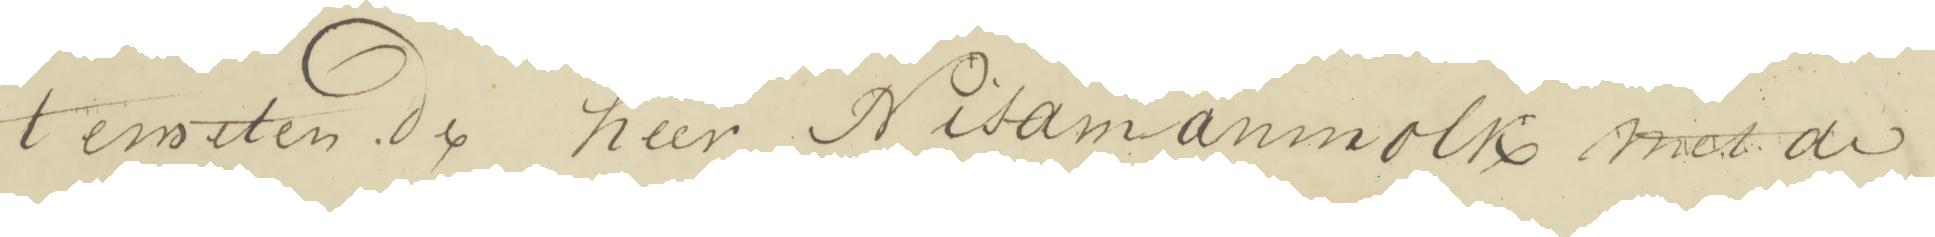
teweten de heer Nisamanmolk met de
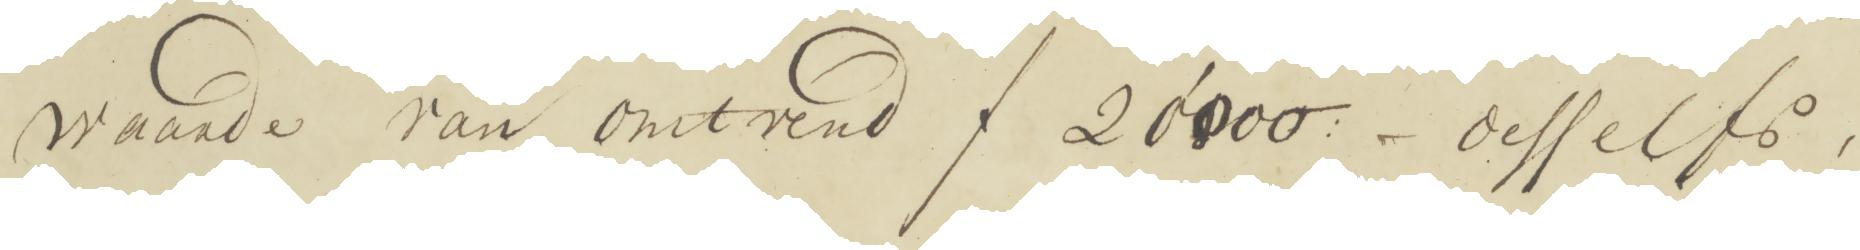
waarde van omtrend ƒ 20'000: — desselfs,
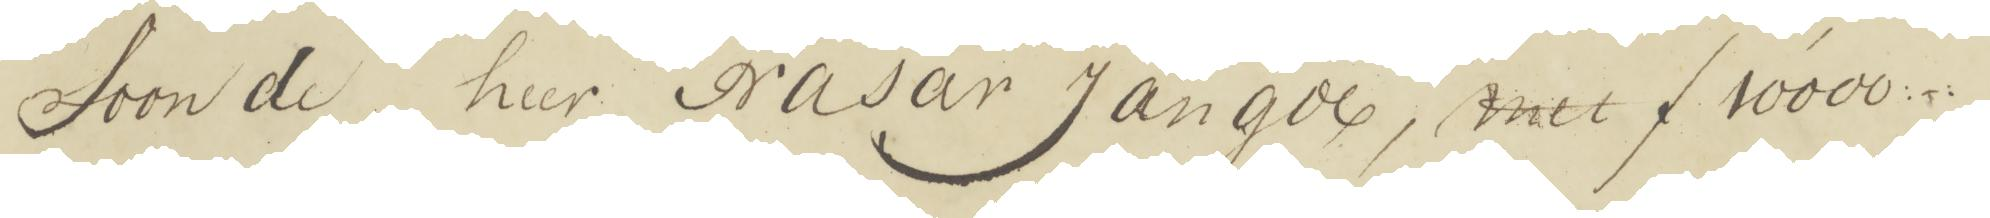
soon de heer Nasar Jangoe, met ƒ 10'000:—:
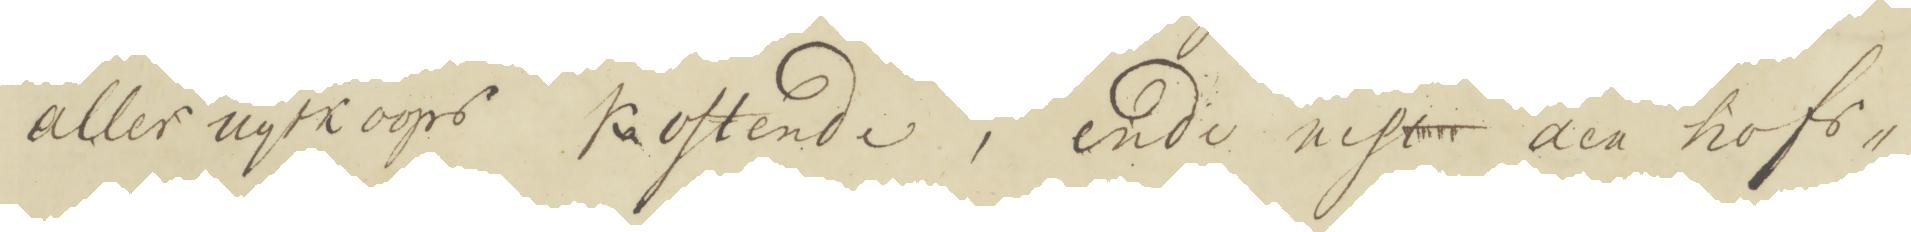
aller uijtkoops kostende, ende rest der hofs„
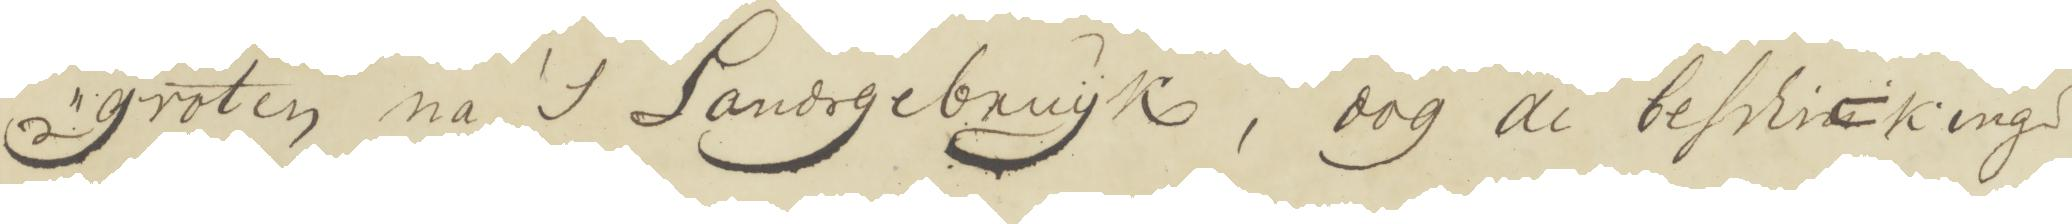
groten na 's Landsgebruijk, dog de beschickinge
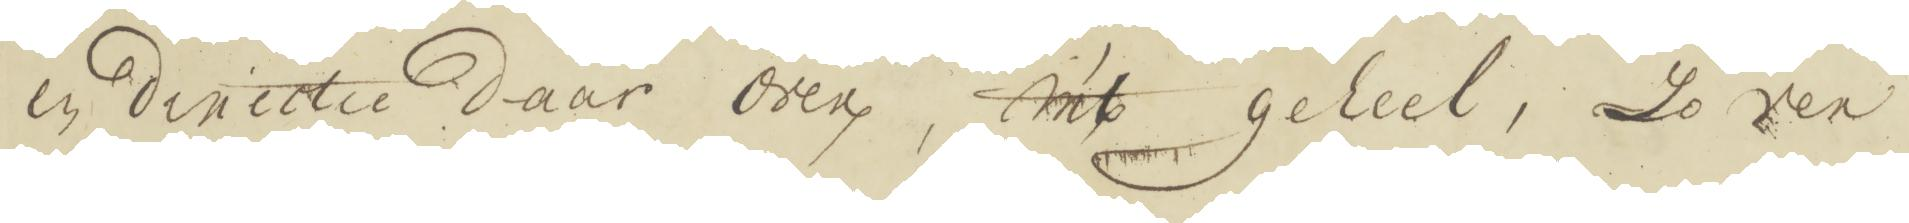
en directie daar over, in't geheel, zo ver
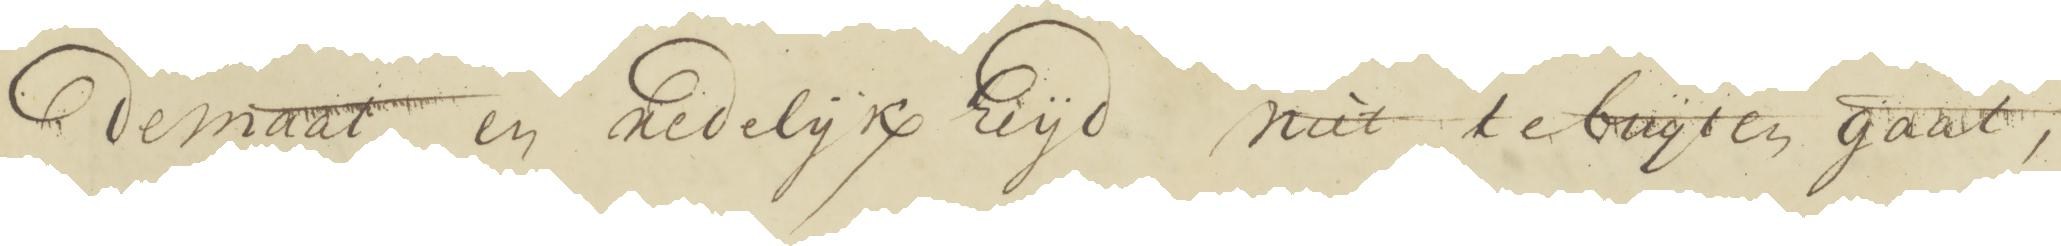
demaat en redelijkheijd niet te buijten gaat,
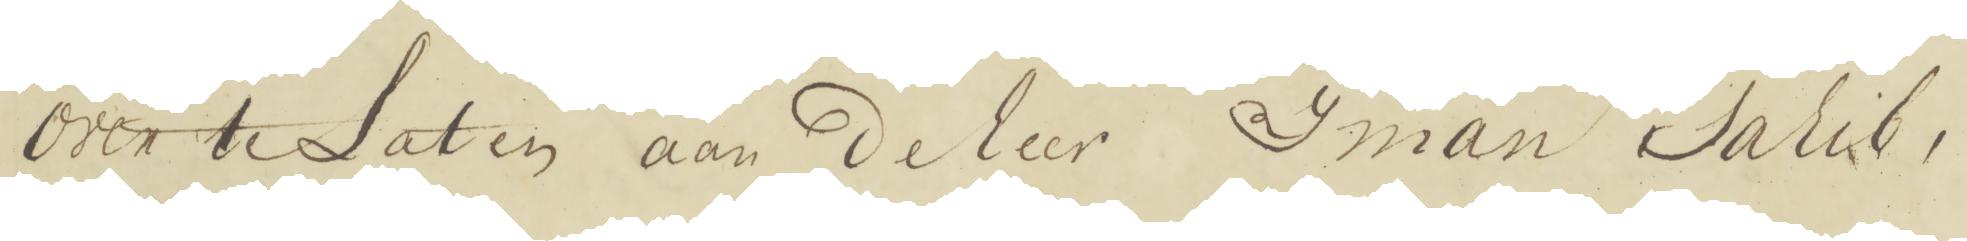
over te laten aan de heer Iman sahib,
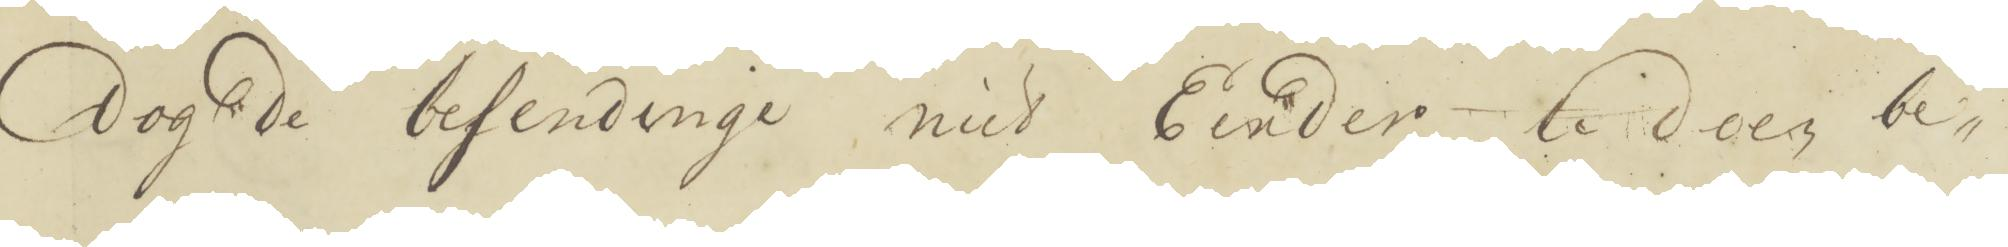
dog de besendinge niet Eerder te doen be„
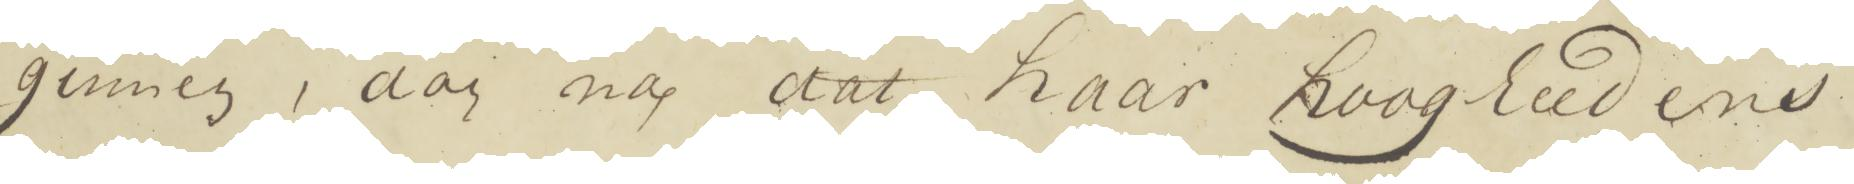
ginnen, dan na dat haar hoog heedens
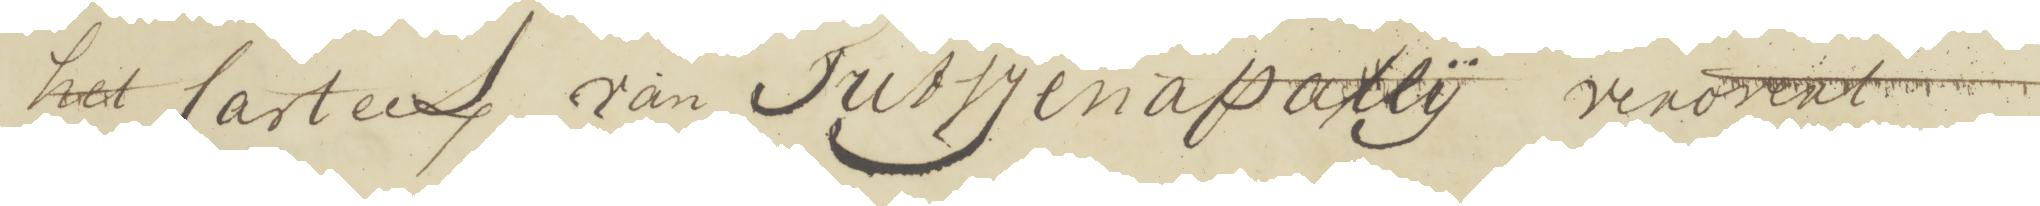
het Casteel van Tritsijenapattij verovert
